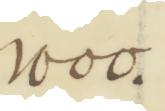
1000.
